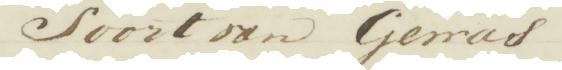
Soort van Gewas
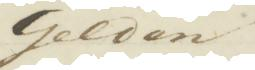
Gelden
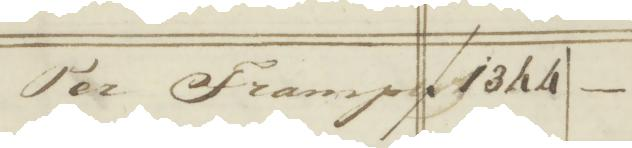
Ter Transp ƒ 1344 —
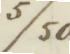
5/50
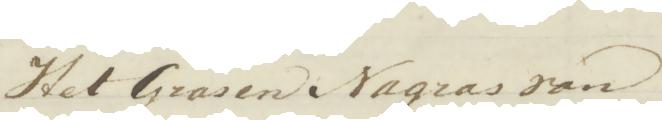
Het Gras en Nagras van
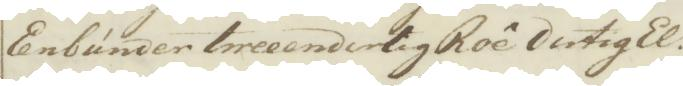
Een bunder tweeendertig Roê dertig El
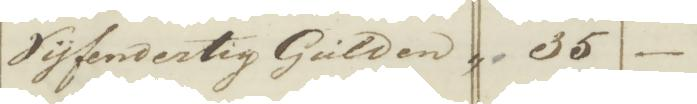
Vijfendertig Gulden „, 35 —
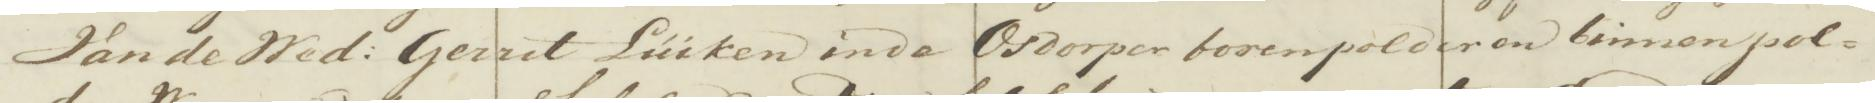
Van de Wed: Gerrit Luiken inde Osdorper bovenpolder en binnen pol=
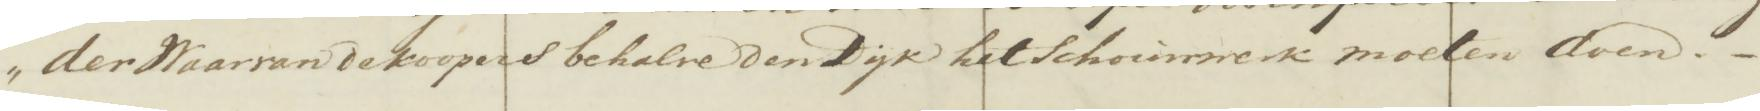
„der Waarvan de koopers behalve den Dijk het schouwwerk moeten doen.-
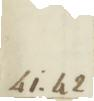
41.42
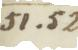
51.52
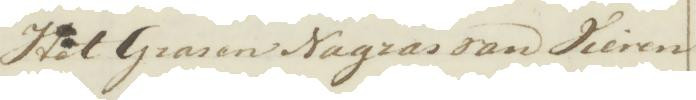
Het Gras en Nagras van Vieren
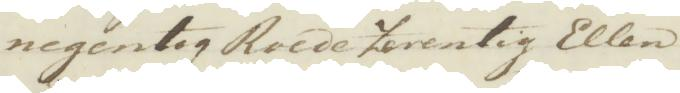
negentig Roede Zeventig Ellen
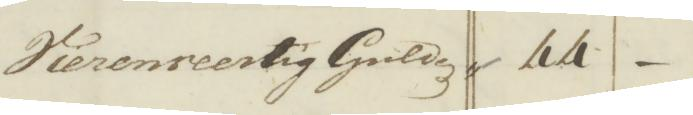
Vierenveertig Gulden „ 44 —
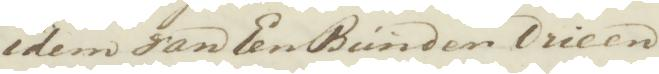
idem van Een Bunder drie en
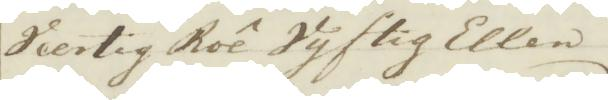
Veertig Roê Vijftig Ellen
